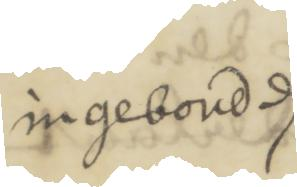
in gebonden
